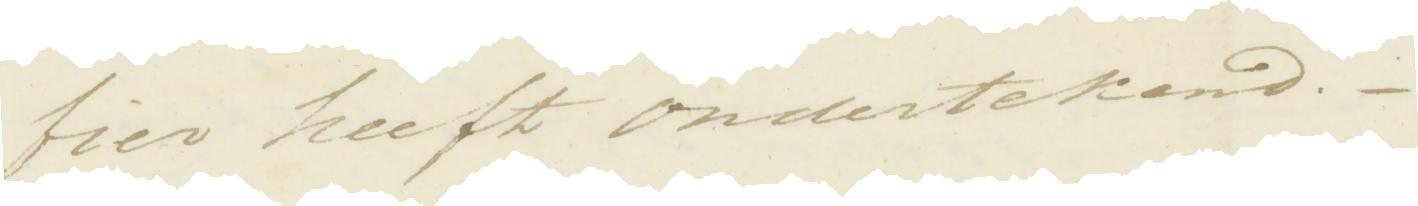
fier heeft ondertekend._
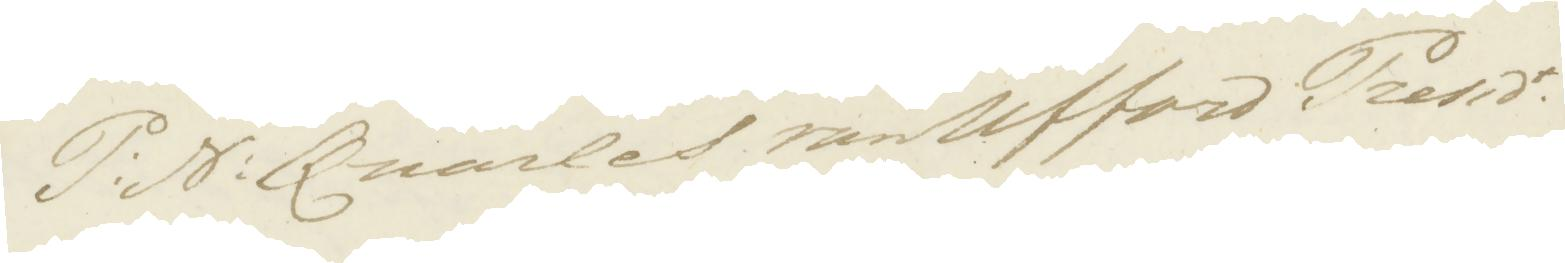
P: N: Quarles van Ufford Presid.t
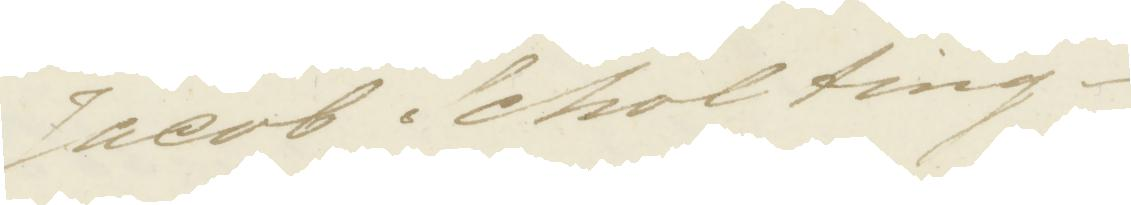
Jacob Scholting -
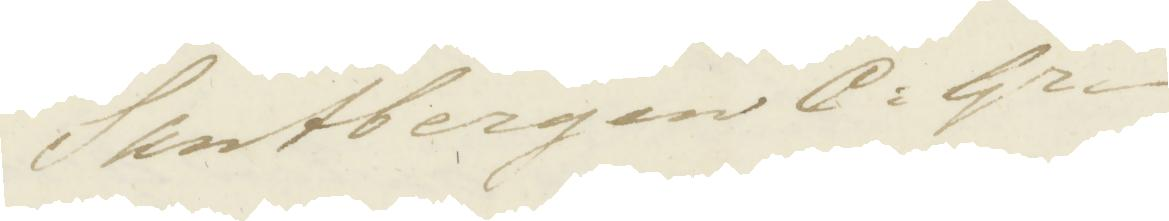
Santbergen C: Gr_
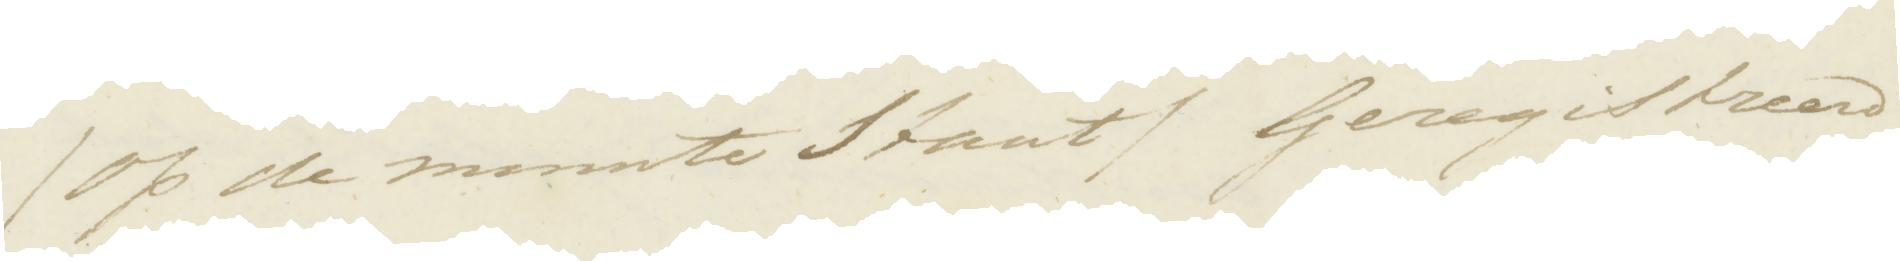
/op de minute staat/ Geregistreerd
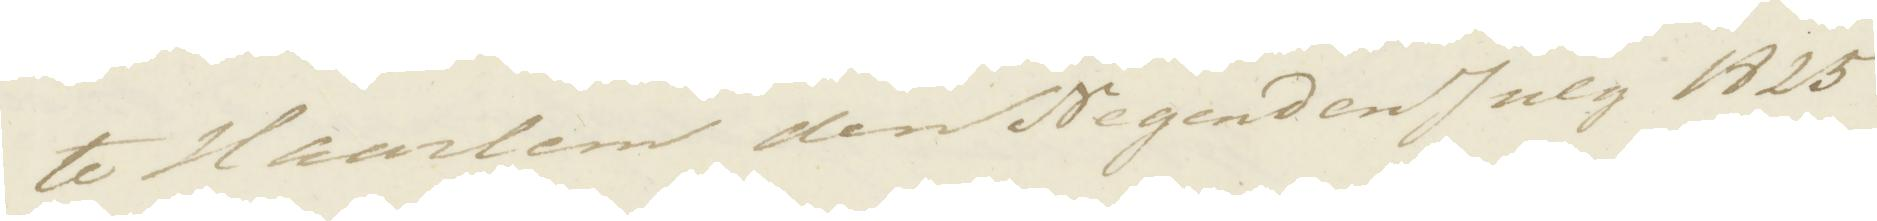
te Haarlem den Negenden July 1825
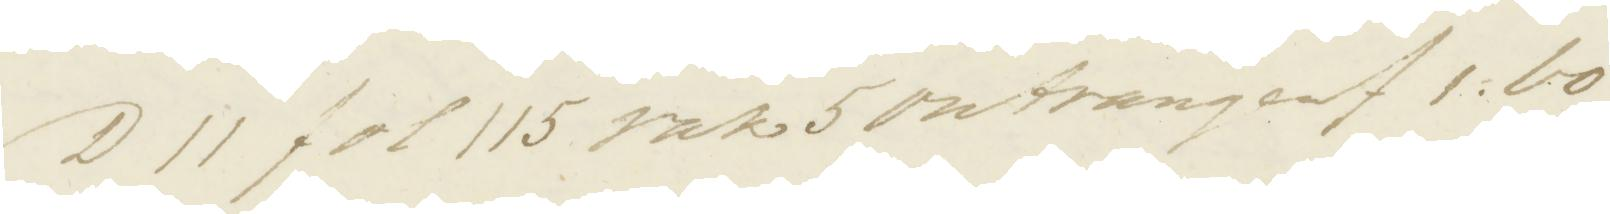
D 11 fol 115 vak 5 ontvangen ƒ 1:60
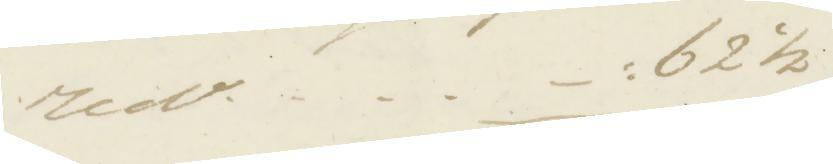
red.e _ _ _ _ :62½
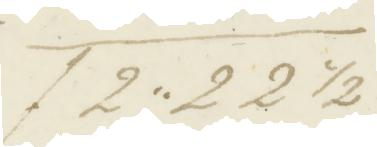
ƒ 2..22½
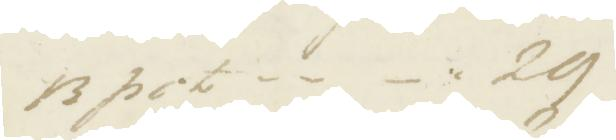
13 pct - - - : 29
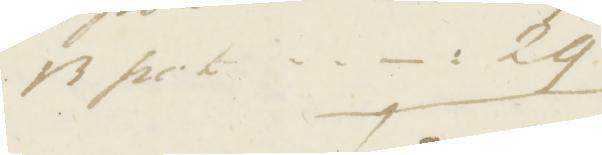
13 pct - . - : 29
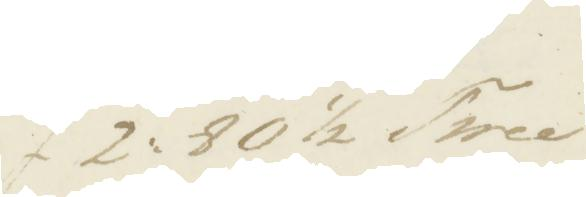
ƒ 2: 80½ Twee
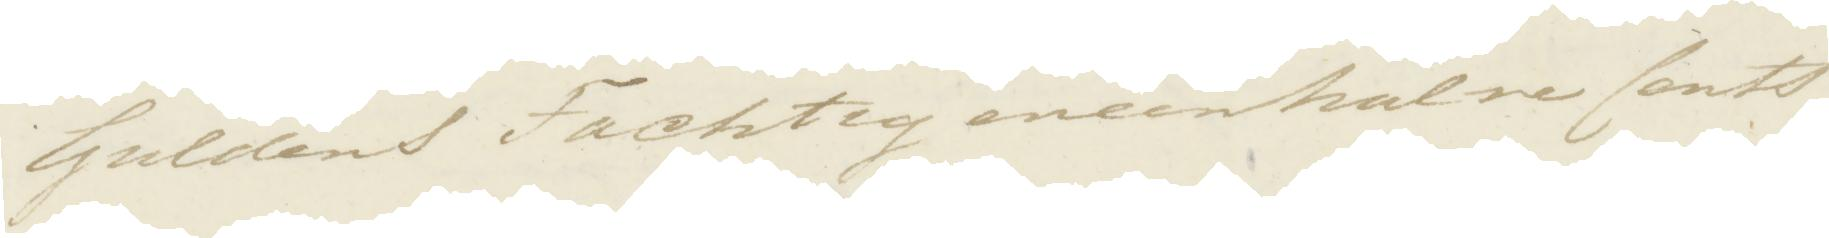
Guldens Tachtig en een halve Cents
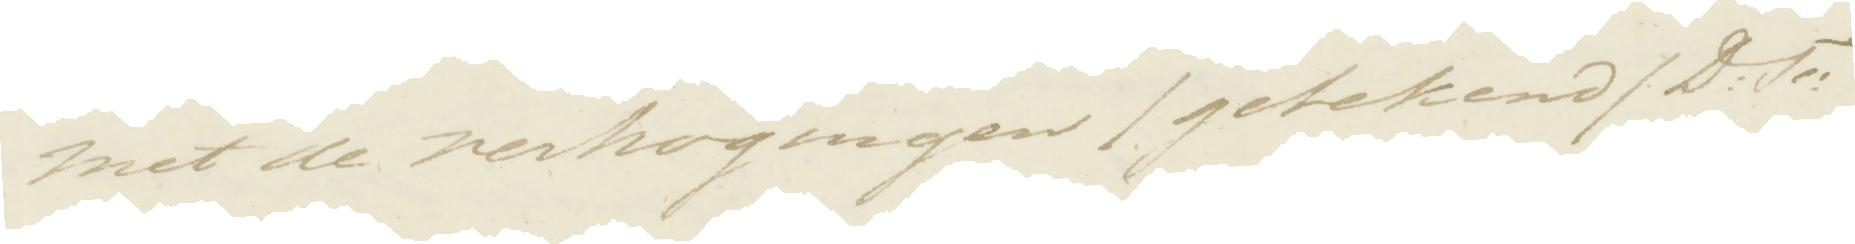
met de verhogingen /getekend/ D. F:
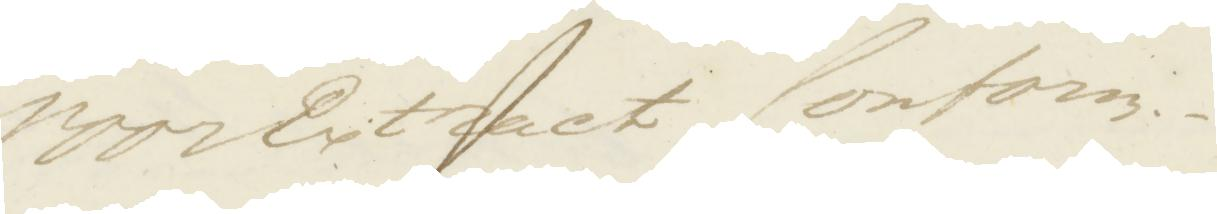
voor Extract Conform.
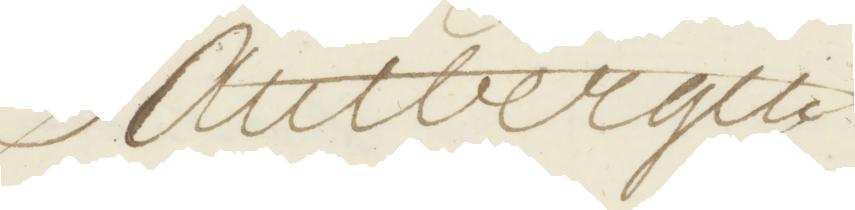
Santberg
